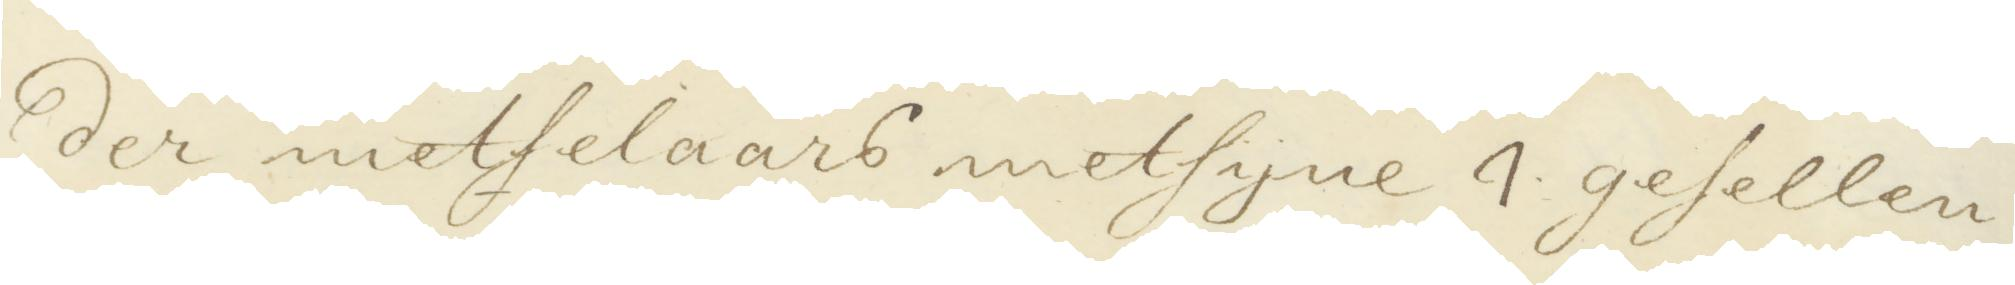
der metselaars met sijne 4: gesellen
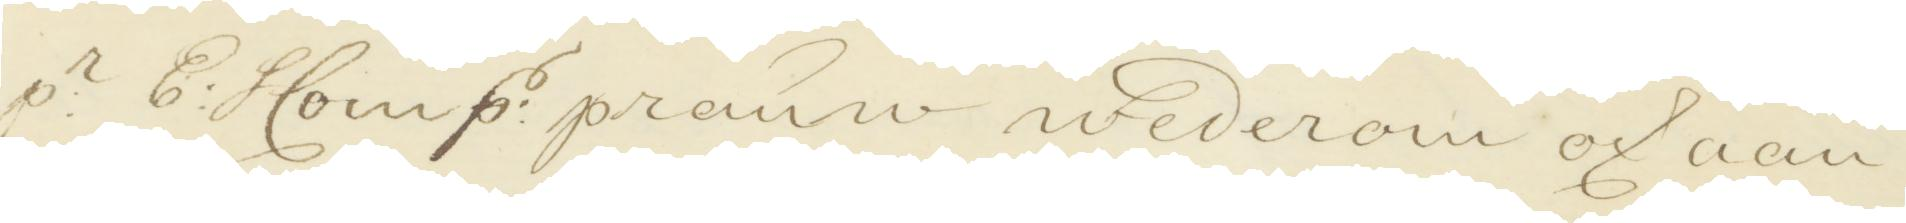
p:r E: sComp:s prauw wederom over aan
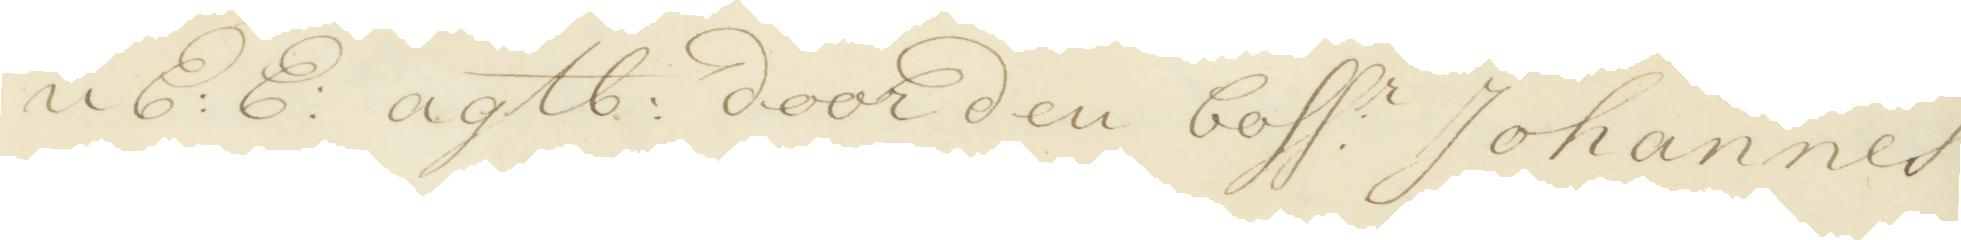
uE:E: agtb: door den boss:r Johannes
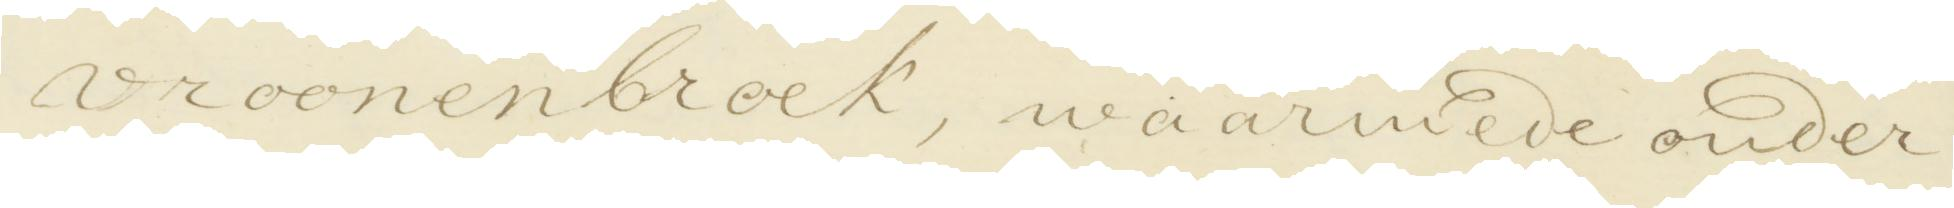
vroonenbroek, waarmede onder
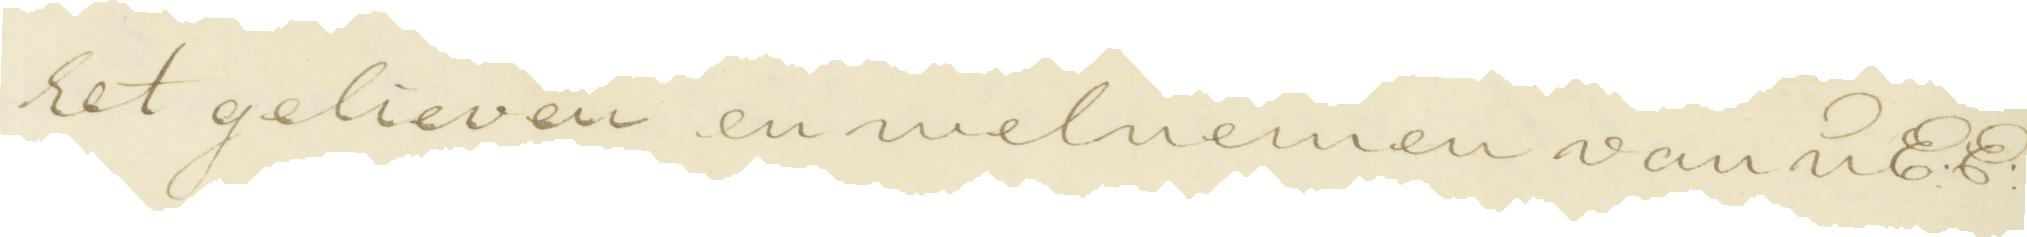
het gelieven en welnemen van uE:E:
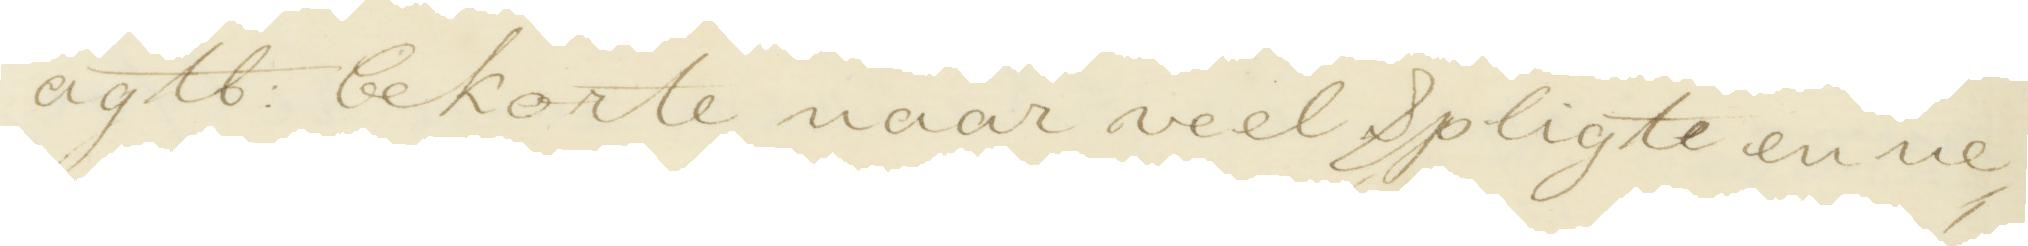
agtb: bekorte naar veel verpligte en ne„
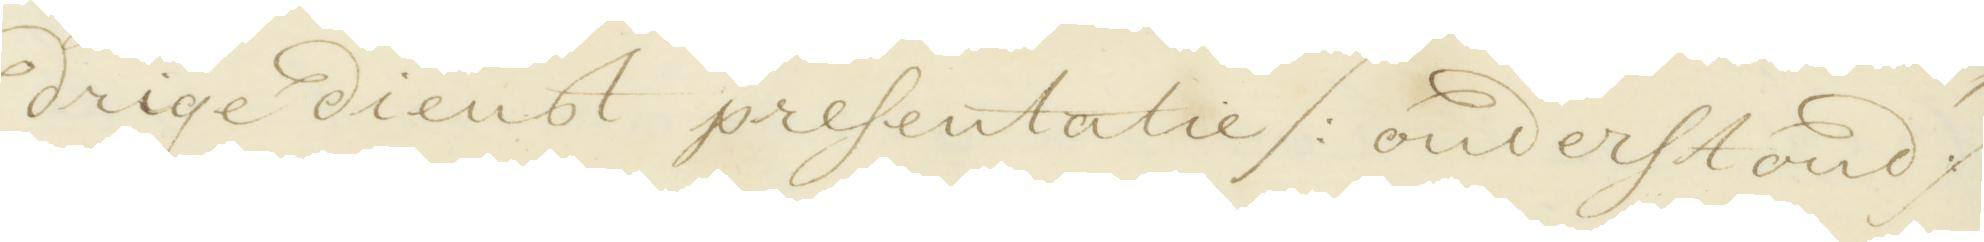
drige dienst presentatie /: onderstond:/
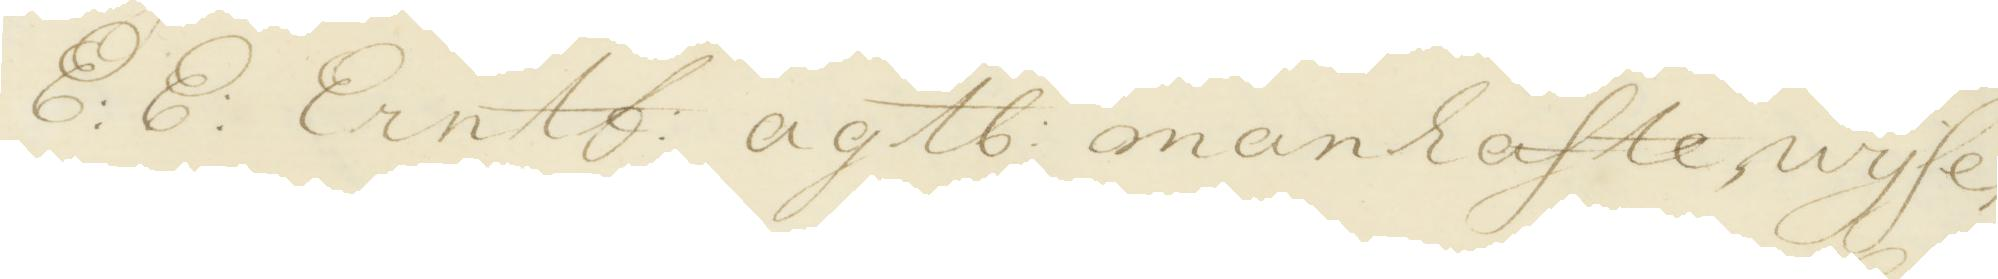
E: E: Erntf: agtb: manhafte, wijse
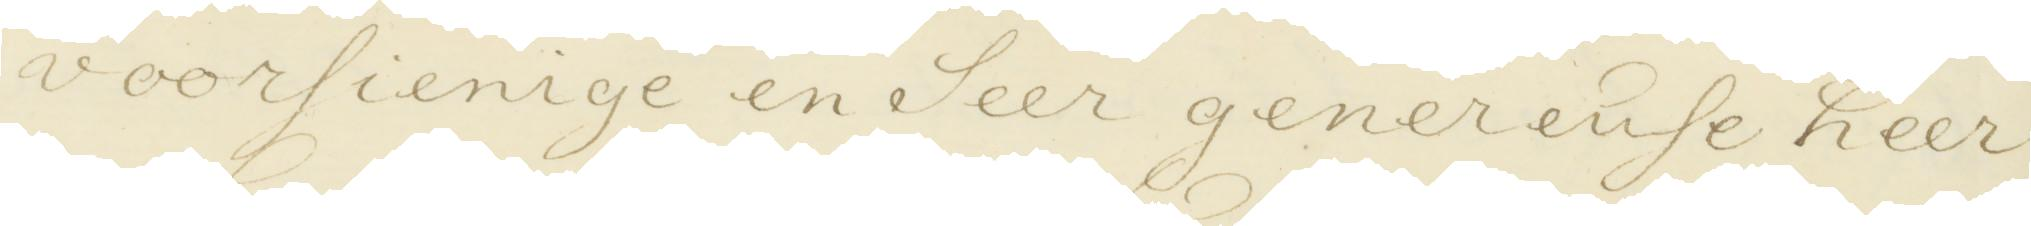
voorsienige en seer genereuse heer
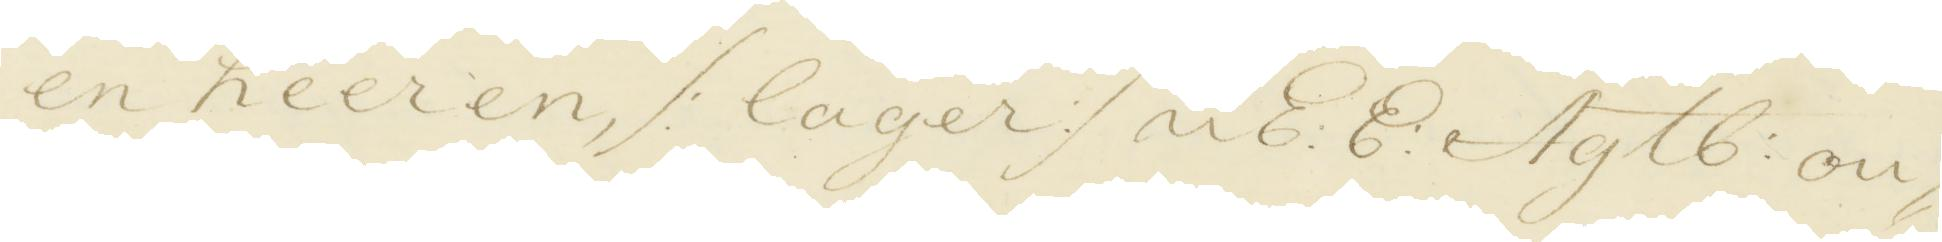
en heeren, /: lager:/ uE:E: Agtb: on„
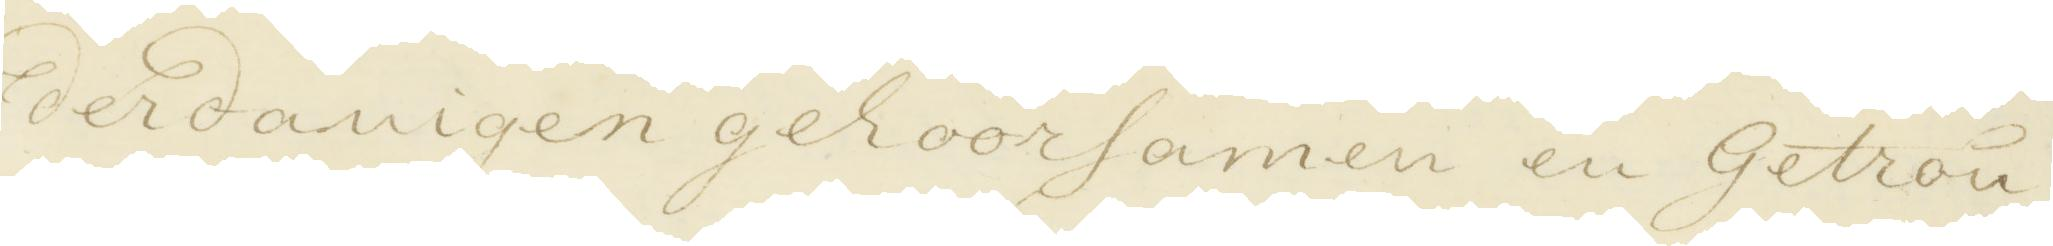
derdanigen gehoorsamen en getrou
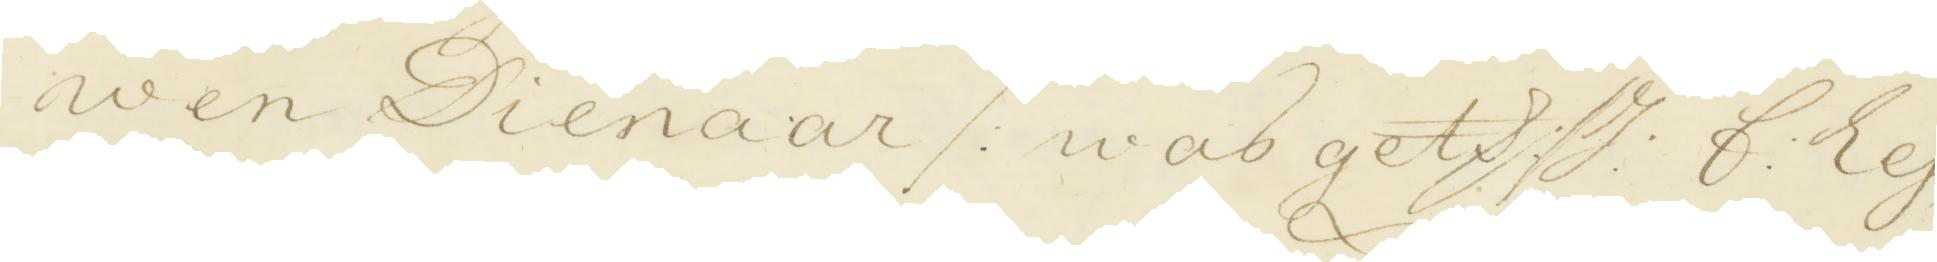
wen Dienaar /: was getver:/ I: f: hes
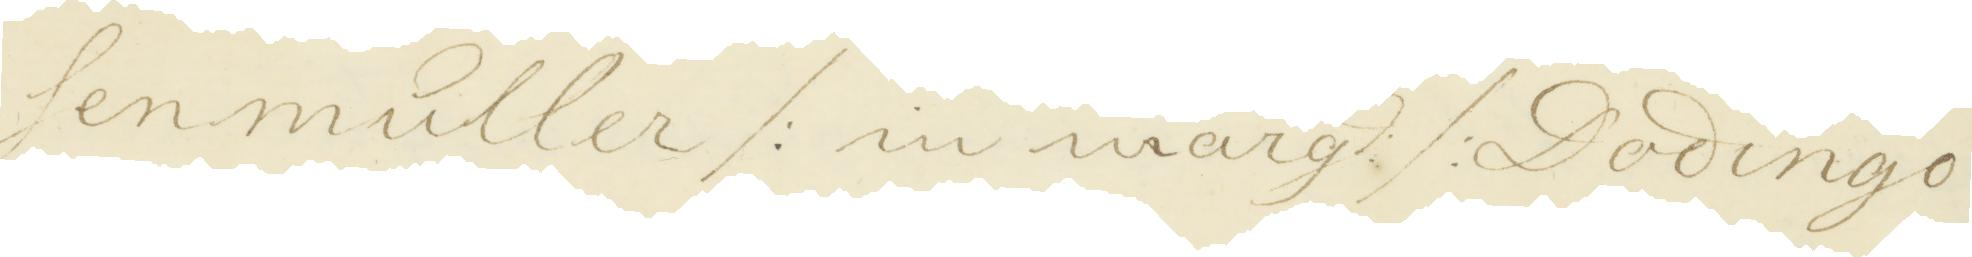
senmuller /: in marg: /: Dodingo
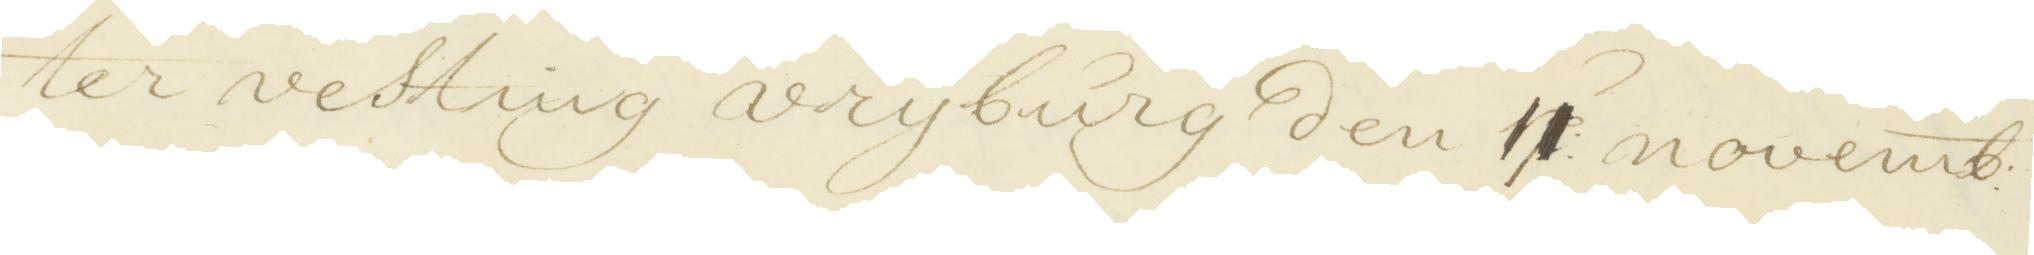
ter vesting vrijburg den 11:' novemb:
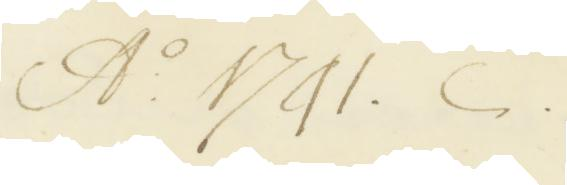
A:o 1741. — .
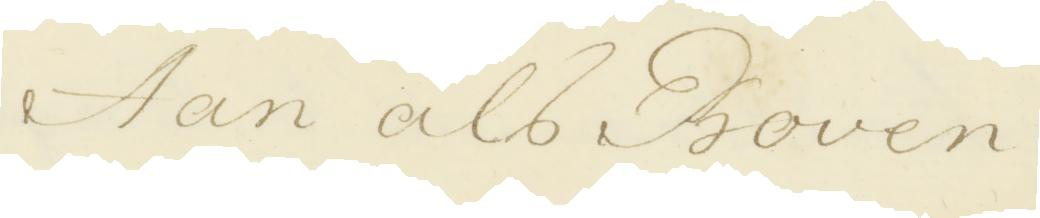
Aan als Boven
